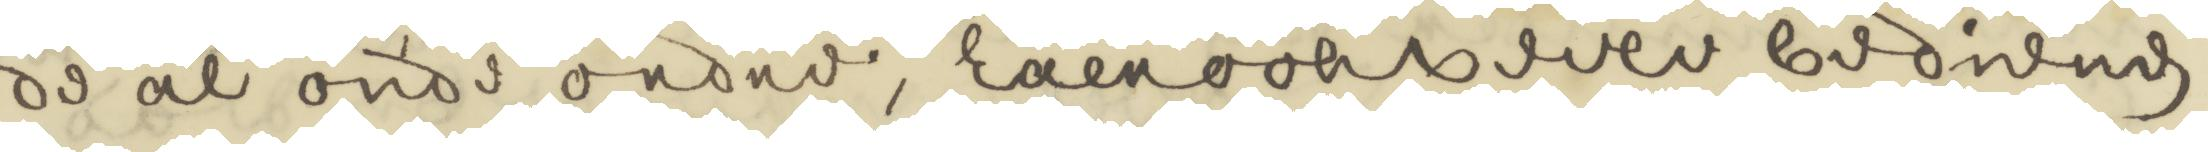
de al oude ordre, haer ook veele bedienen
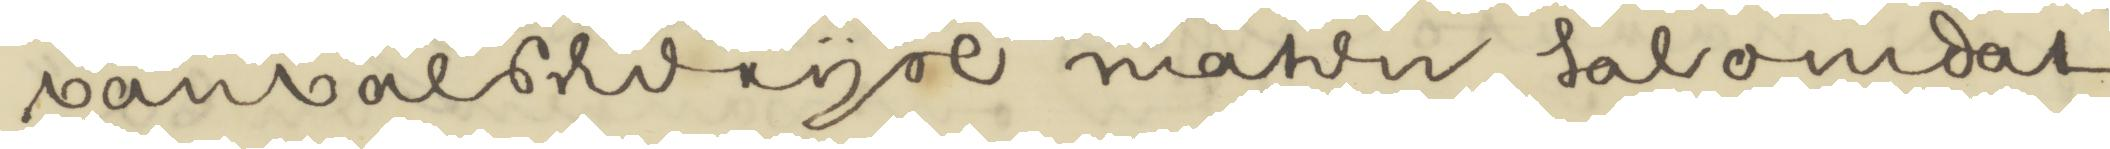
van valsche rijst maten sal om dat
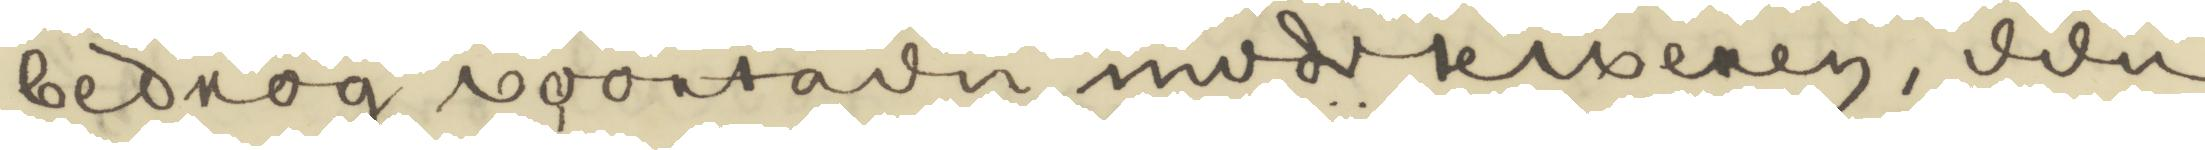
bedrog voortaen mede te weren, een
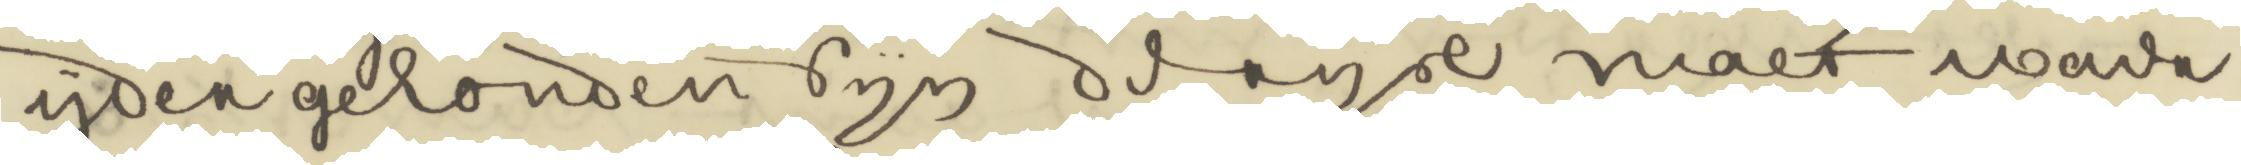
ijder gehouden sijn de rijs maet waer
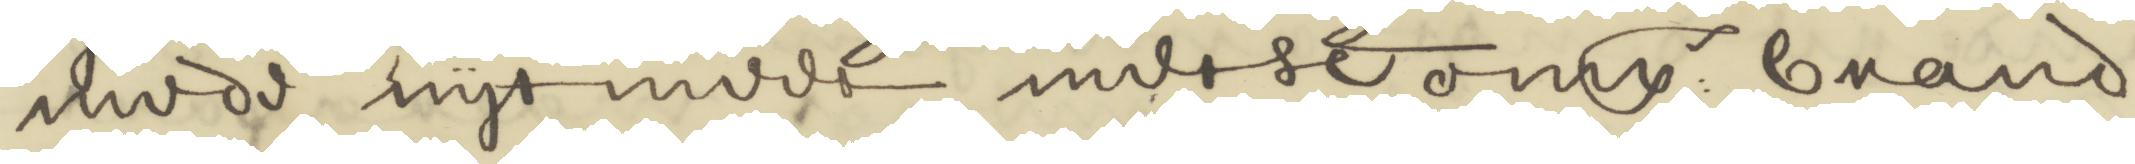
mede uijt meet met scomp:s brand
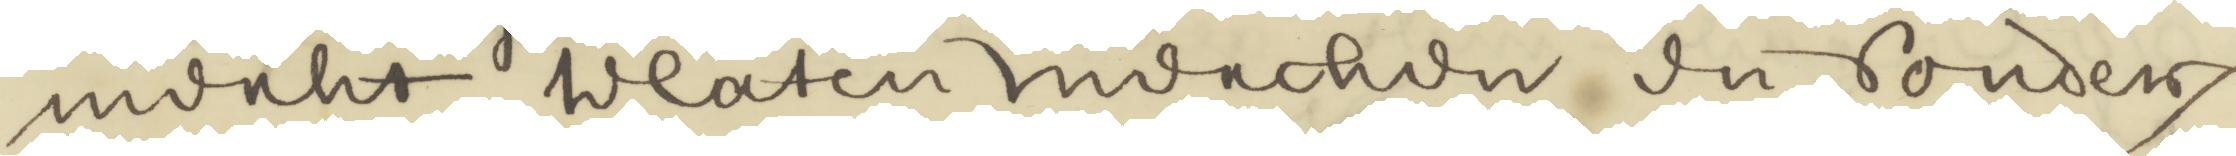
merkt telaten mercken en sonder
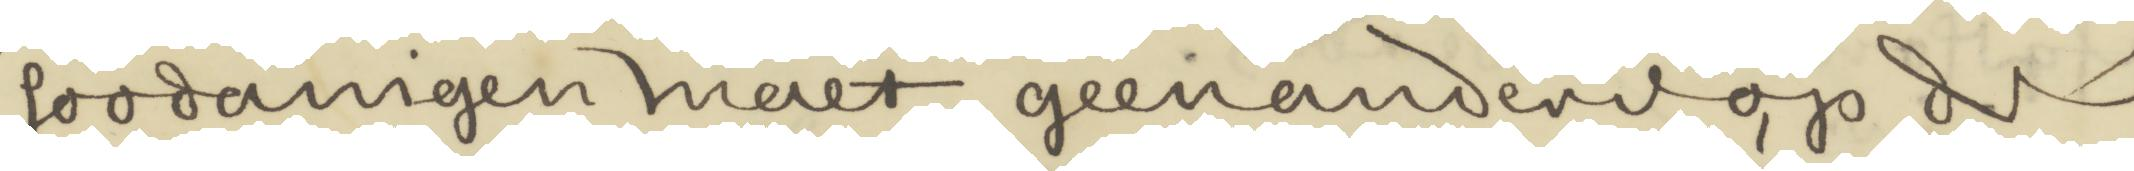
soodanigen maet geen andere op de
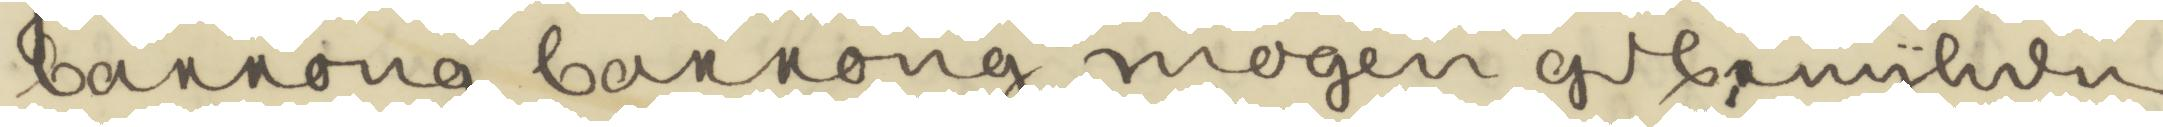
barrong barrong mogen gebruiken
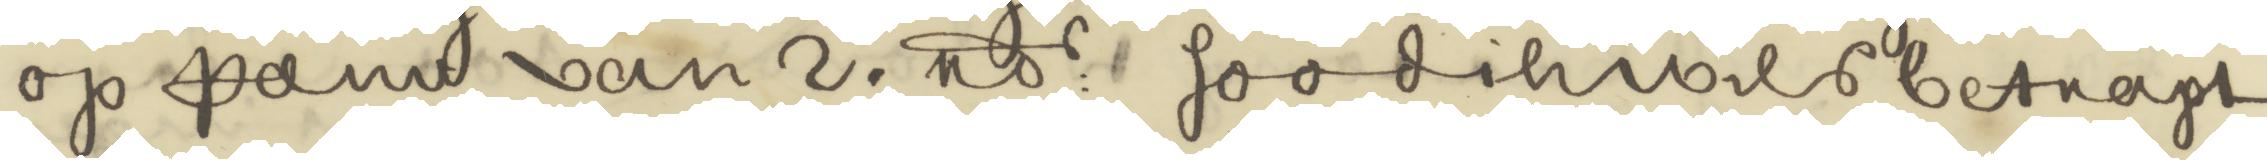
op pane van 2. rd:s soo dikwils betrapt
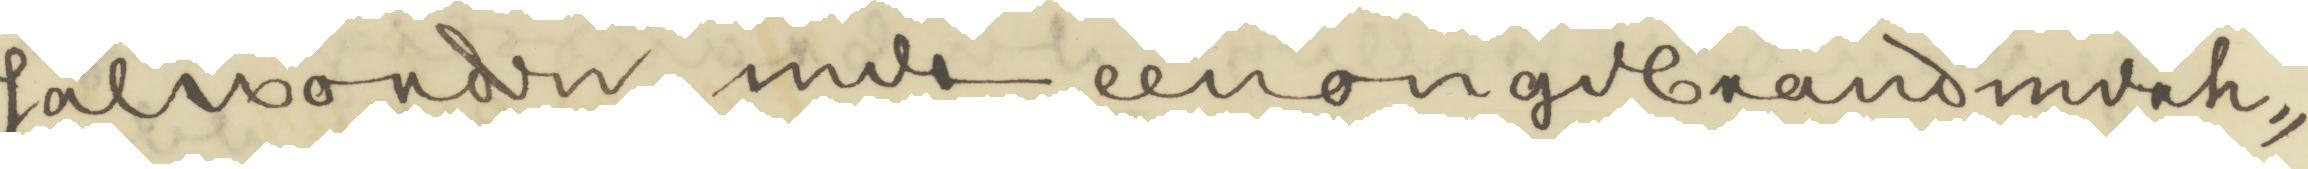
sal worden met een ongebrandmerk„
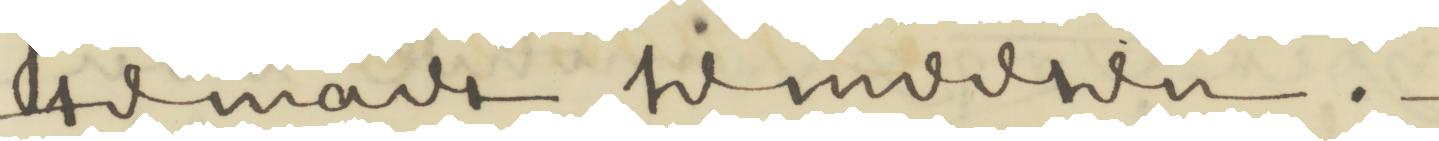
te maet te meeten.
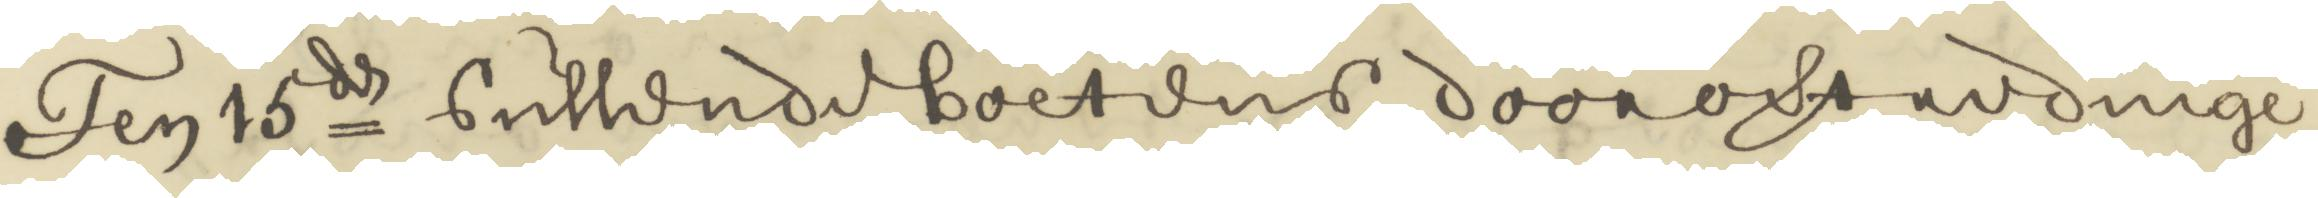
Ten 15=den sullende boetens door overtredinge
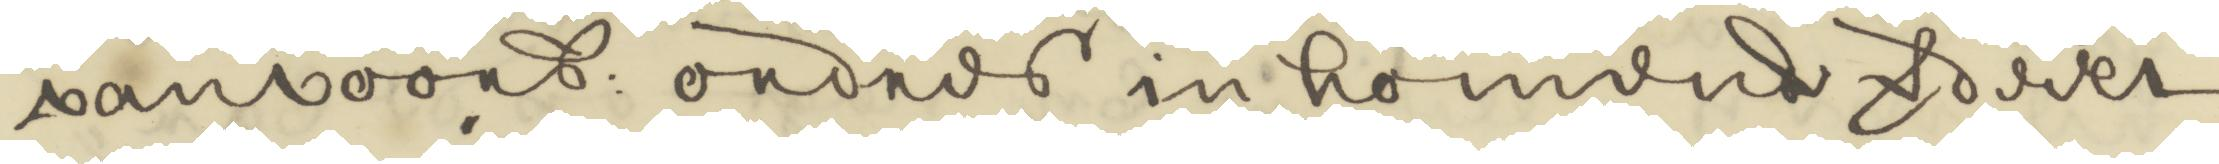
van voors: ordres in komende verdeelt
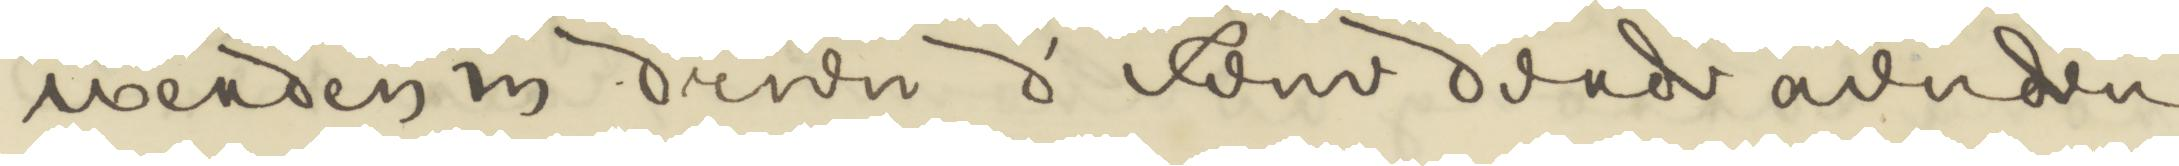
werden in drien d’ Eene derde aen den
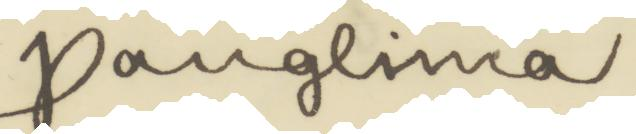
Panglima
